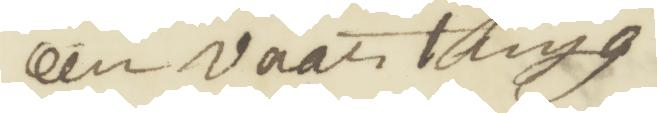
een vaartuijg
